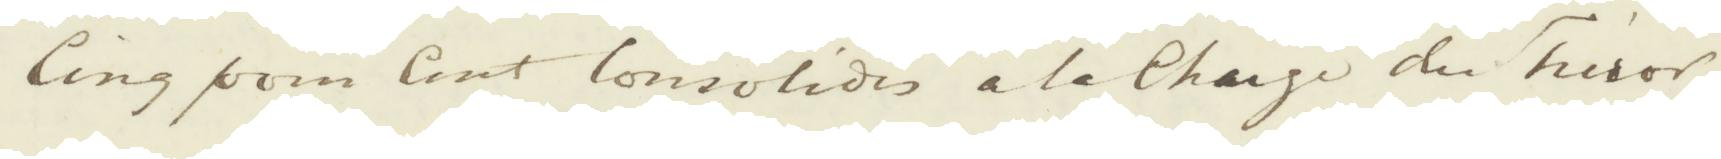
Cinq pour Cent Consolidés a le Charge du Trésor
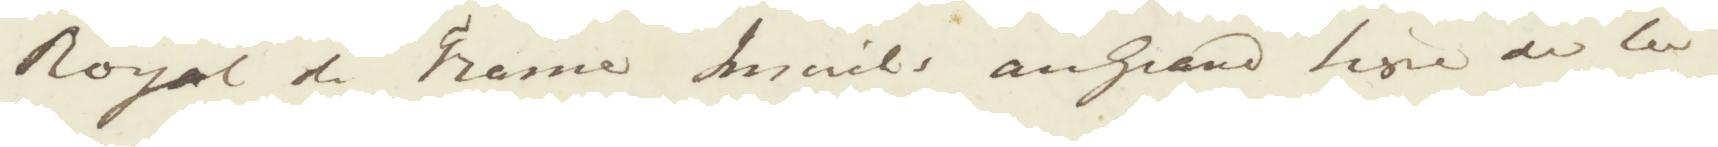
Royal de France miuils au Grand hwe de la
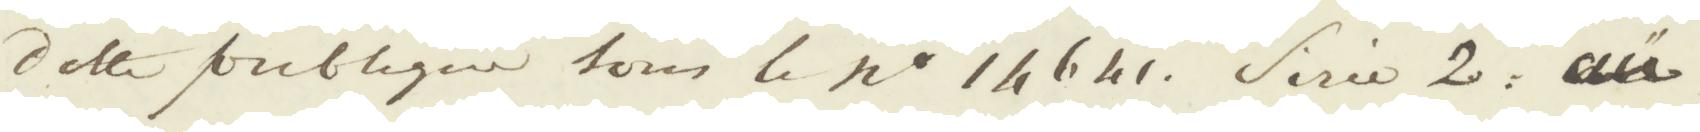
dette publique sous le n.o 14641. Série 2: au
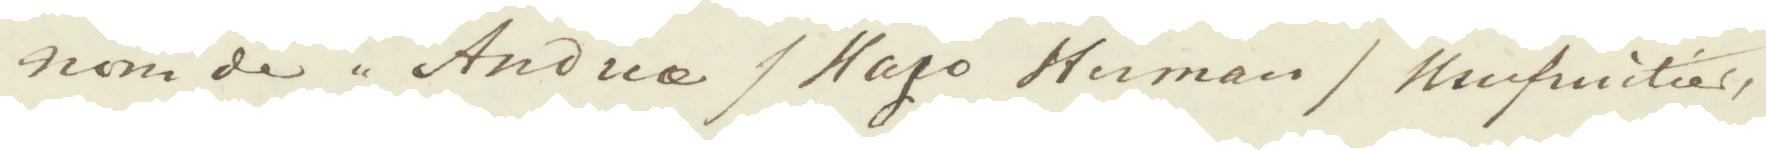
nom de „ Andrea J Hajo Herman / Huifruitier,
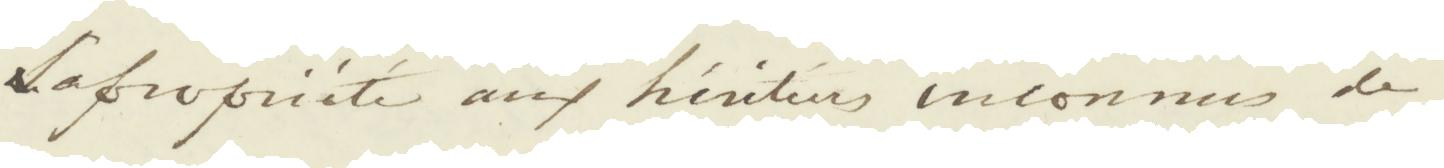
Sa propriété aux héritiers inconnus de
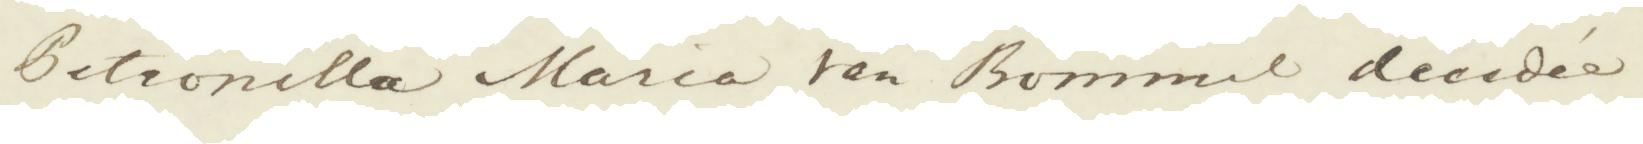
Petronella Maria van Bommel décédée
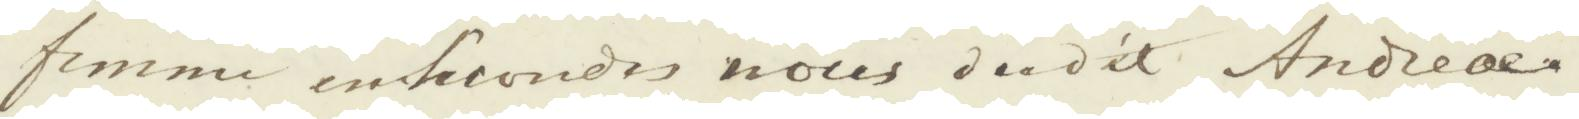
femme en secondes notes deadit Andreae
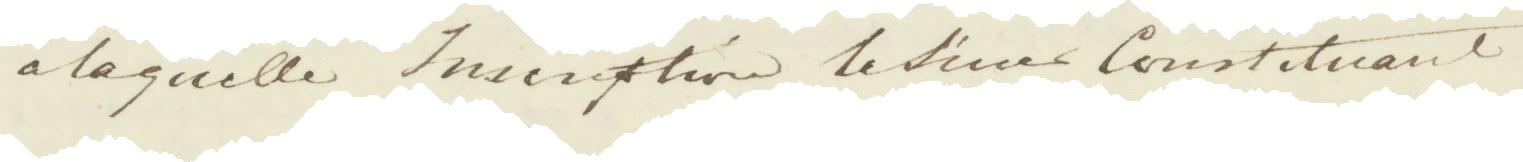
a laquelle Inscription le sieur Constituant
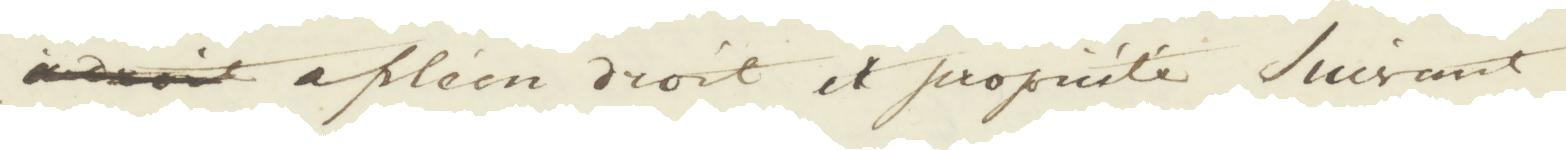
a droit a plein droit et propriété suivant
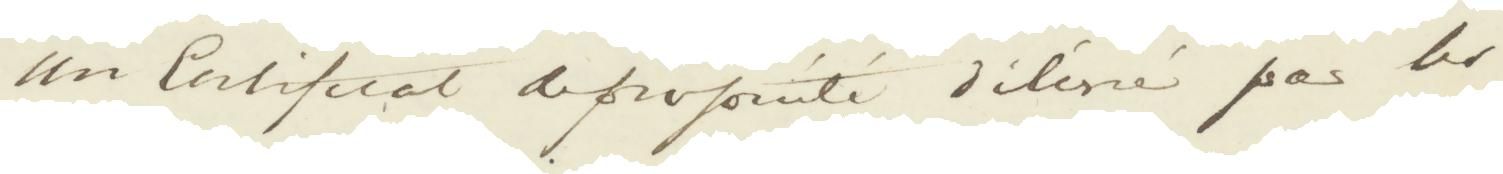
un Certificat de propriété délivré pas les
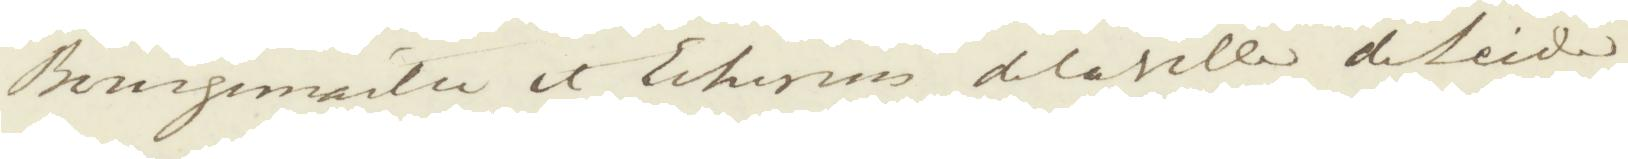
Bourgemaitre et Echevins de la ville de Leide
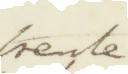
trente
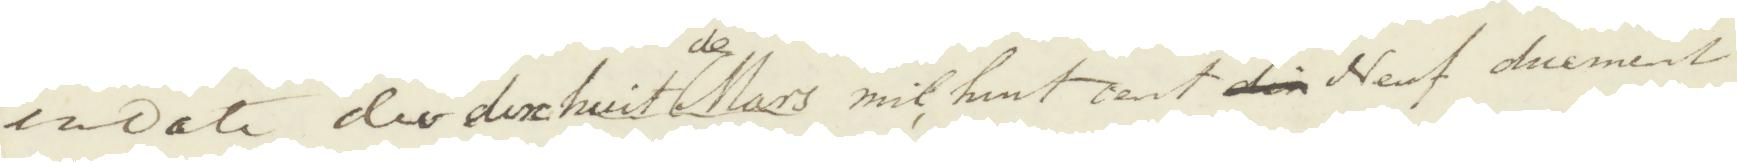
en date du dixhuit de Mars mil, huit cent dix Neuf duement
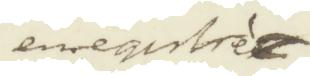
enregistrée
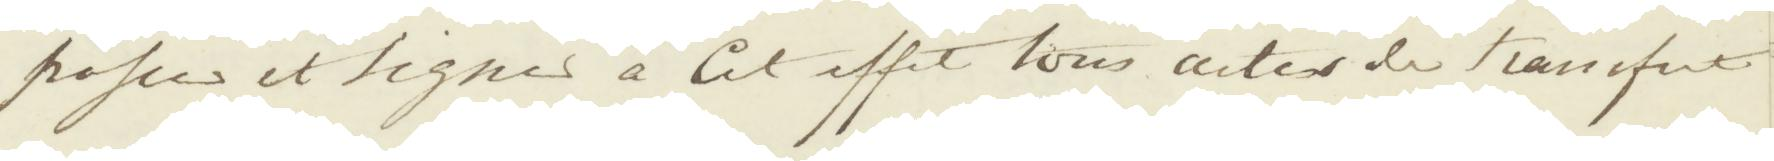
posees et signes à Cet effet tous actes de Transfert
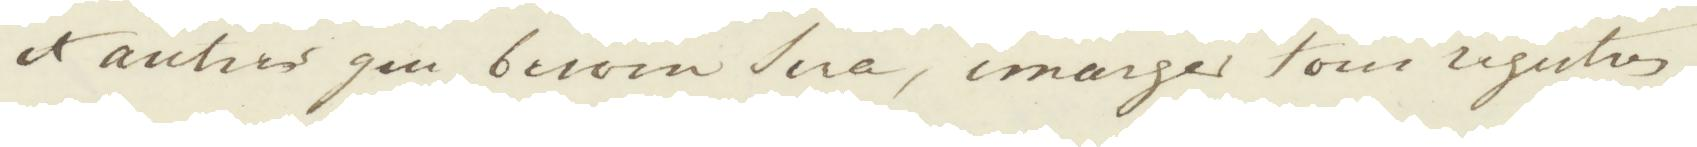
et autres qui besoin sira, émarger tous registres
